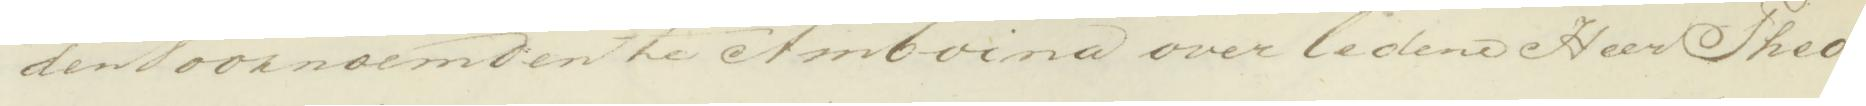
den Voornoemden te Amboina over ledene Heer Theo
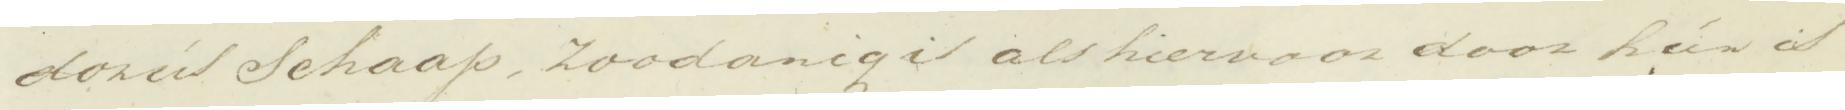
dorus Schaap, zoodanig is als hiervoor door hun is
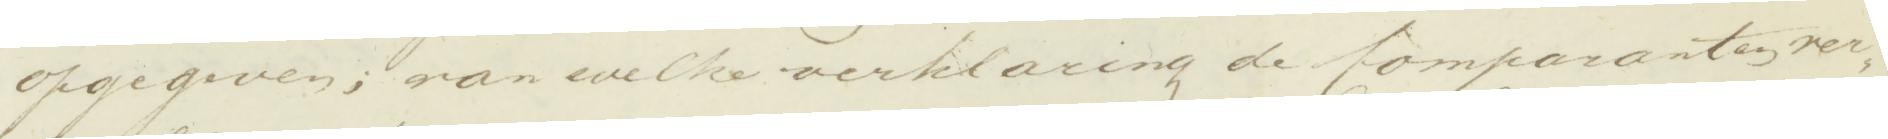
opgegeven; van welke verklaring de Comparanten ver„
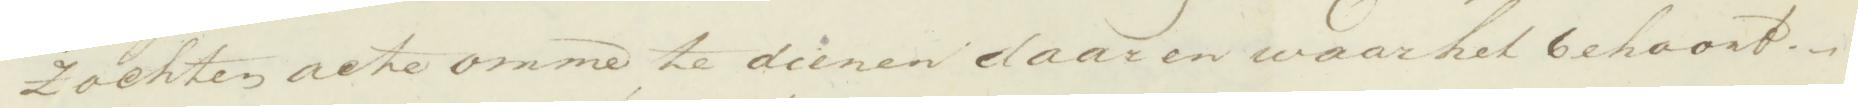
zochten acte omme te dienen daar en waar het behoort.
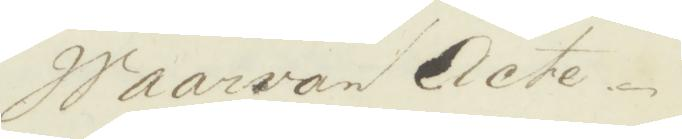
Waarvan Acte—
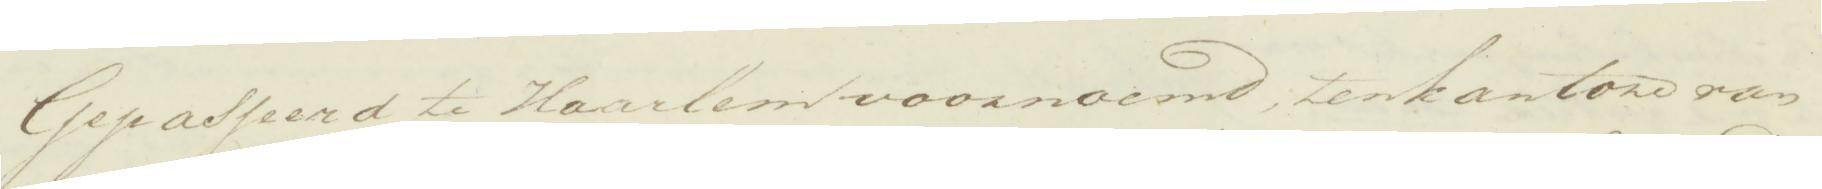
Gepasseerd te Haarlem voornoemd, ten kantore van
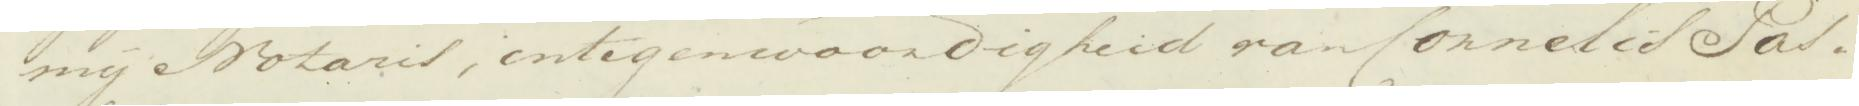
mij Notaris, integenwoordigheid van Cornelis Pas„
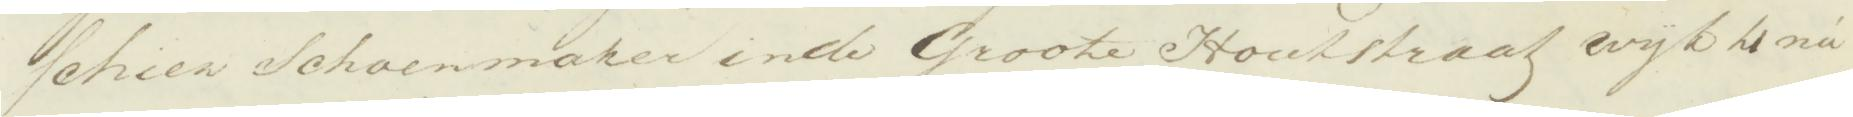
schier Schoenmaker inde Groote Houtstraat wijk 4 nu
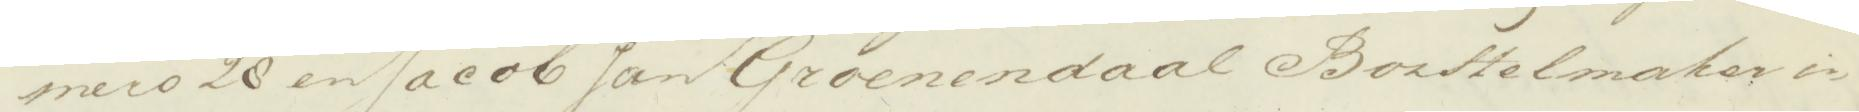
mero 28 en Jacob Jan Groenendaal Borstelmaker in
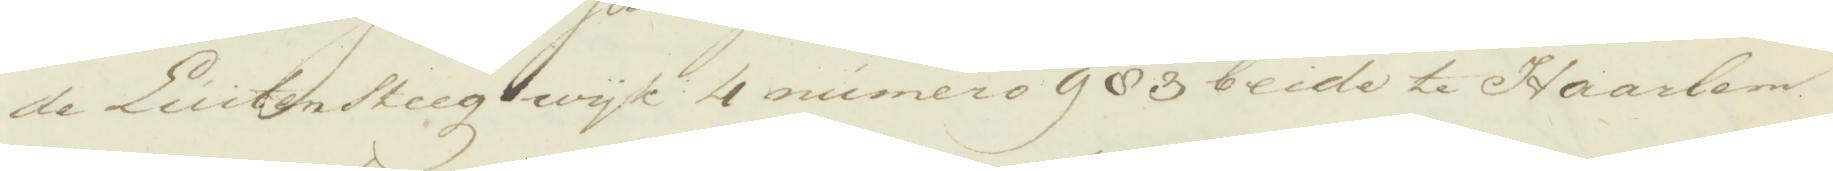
de Luitensteeg wijk 4 numero 983 beide te Haarlem.
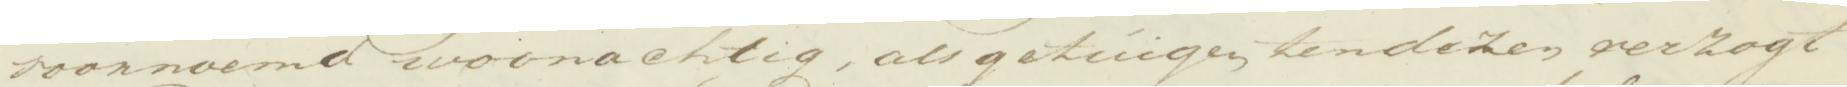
voornoemd woonachtig, als getuigen ten dezen verzogt
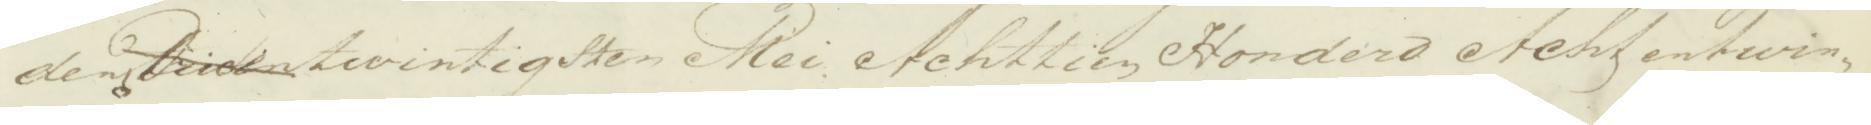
den ¶Drieen twintigsten Mei, Achttien Honderd Achtentwin„
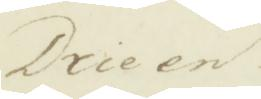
Drie en
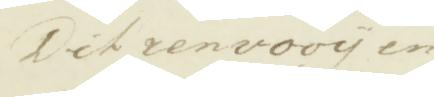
Dit renvooij en
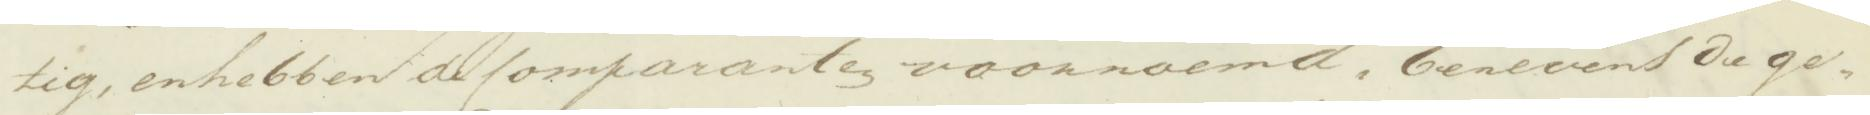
tig, en hebben de Comparanten voornoemd, benevens de ge„
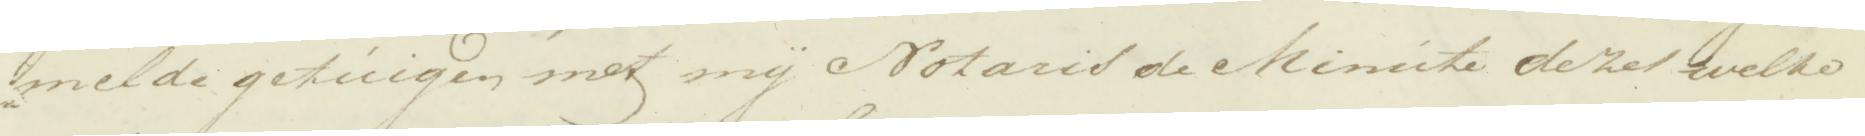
melde getuigen met mij Notaris de Minute dezes welke
